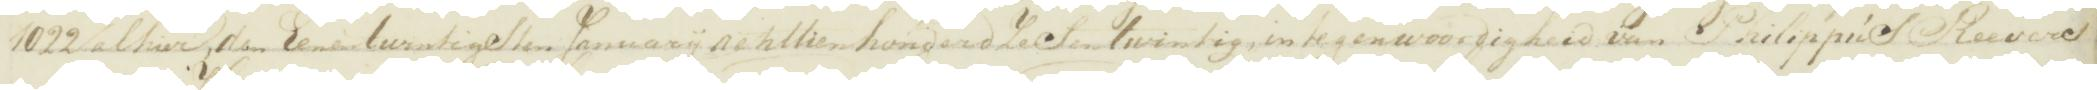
1022 alhier, den Eenen twintigsten Januarij achttien honderd zesentwintig, in tegenwoordigheid van Philippus Reevers
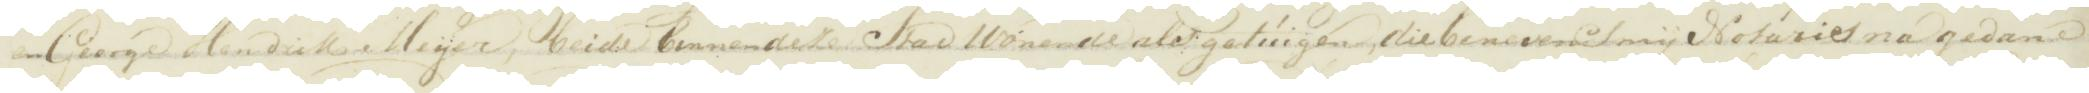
en George Hendrik Meijer, beide binnen deze stad Wonende als getuigen, die benevens mij Notaris na gedane
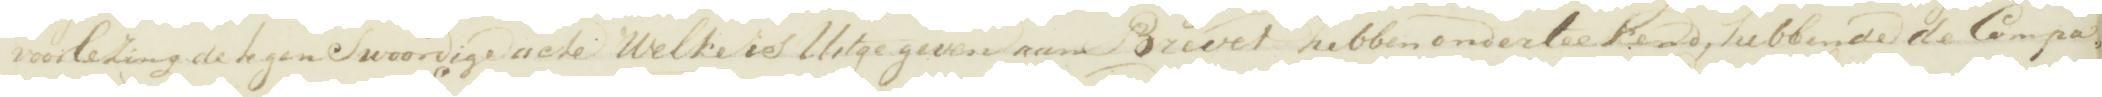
voorlezing de tegenswoordige acte welke is Uitgegeven aan Brevet, hebben onderteekend, hebbende de Compa
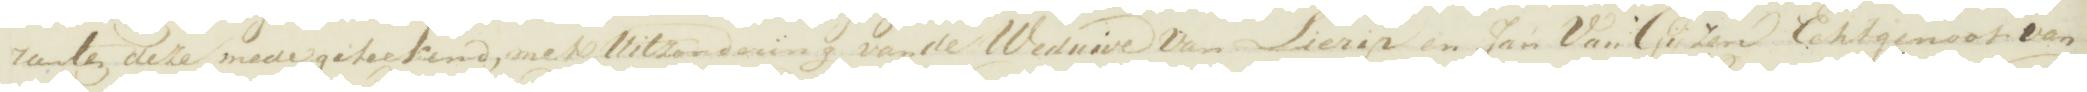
ranten deze mede geteekend, met Uitzondering van de Weduwe van Lierip en Jan Van Gijzen Echtgenoot van
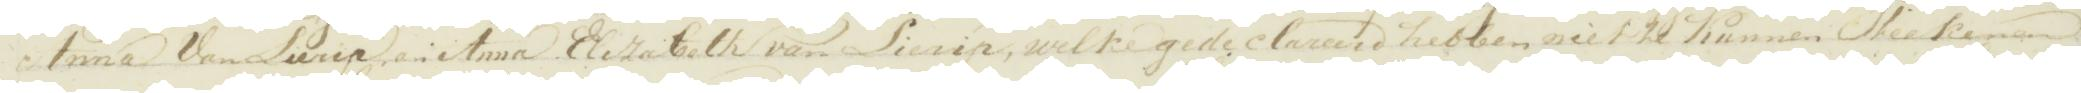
Anna van Lierip, en Anna Elizabeth van Lierip, welke gedeclareerd hebben niet te kunnen teekenen
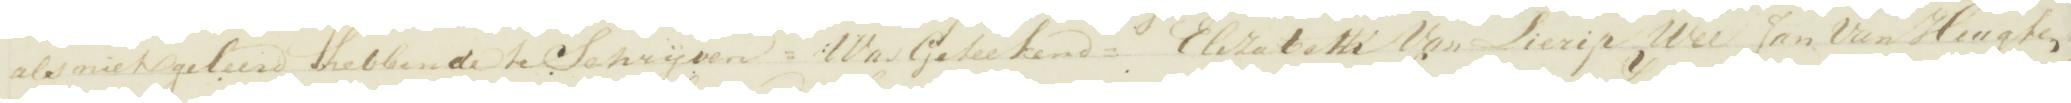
als niet geleerd hebbende te schrijven = Was Geteekend = Elizabeth Van Lierip, Wil Jan Van Heugten
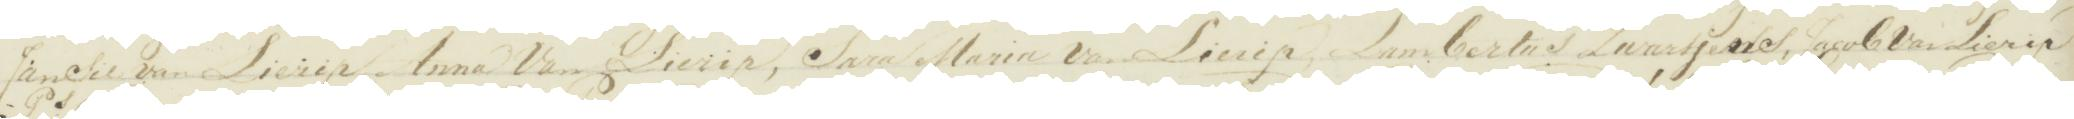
Jansie van Lierip, Anna Van Lierip, Sara Maria van Lierip, Lambertus Zwartjens, Jacob van Lierip
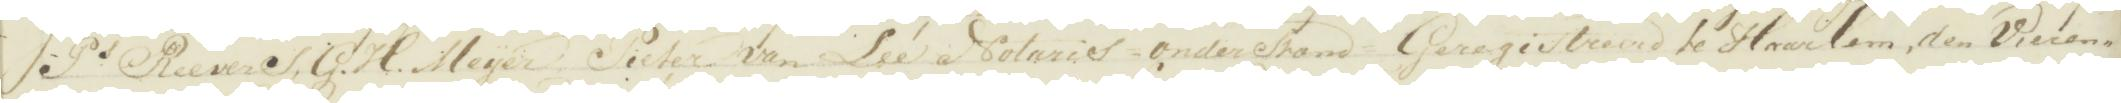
P.s Reevers. G. H. Meijer Pieter van Lee Notaris = onderstond Geregistreerd te Haarlem, den Vieren,
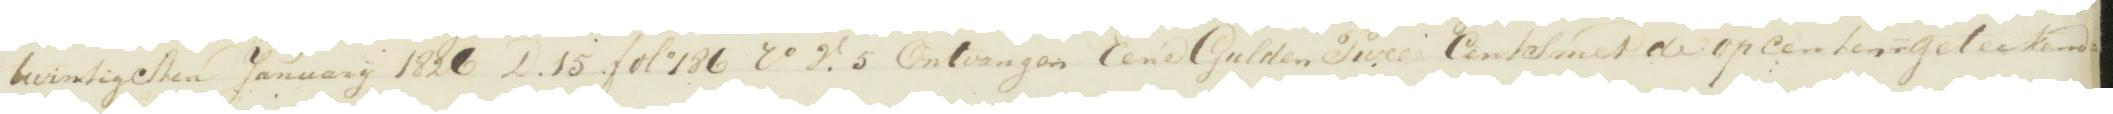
twintigsten Januarij 1826 D.15 folo 186 ro V. 5 Ontvangen Eene Gulden Twee Cents met de opCenten geteekend:
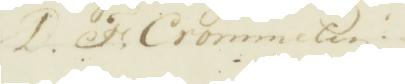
D. F. Crommelin:
